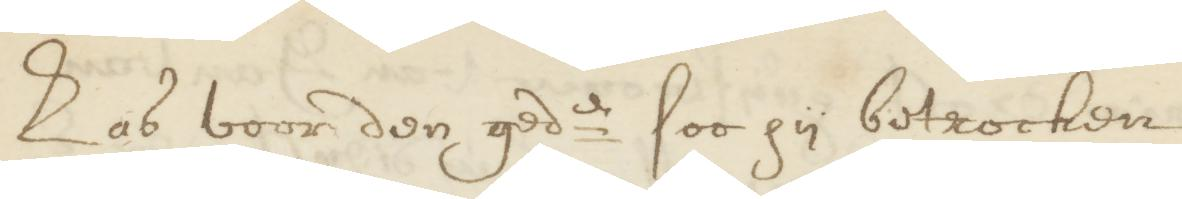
Zas voor den ged=e soo hij betrocken
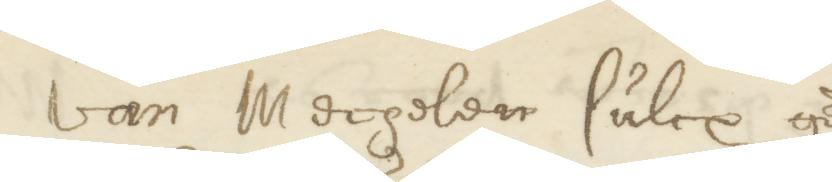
van Mechelen sulcx ged=e, om het
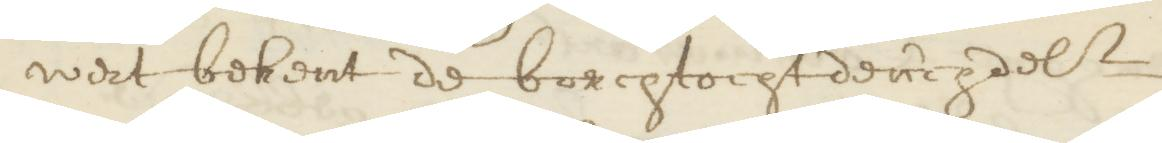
wert bekent de borchtocht deuchdelijk
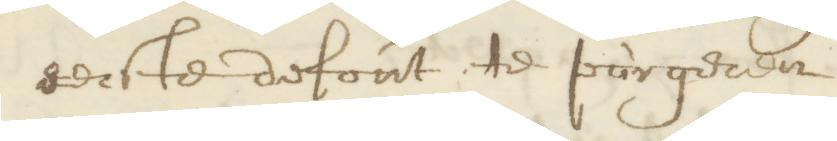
eerste defout te purgeren
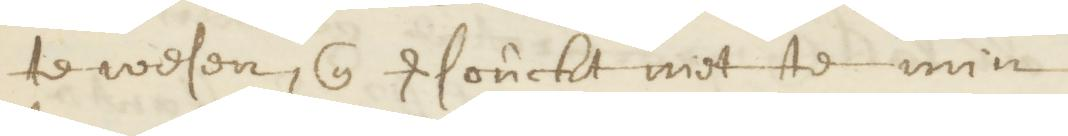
te wesen, ende versouckt niet te min
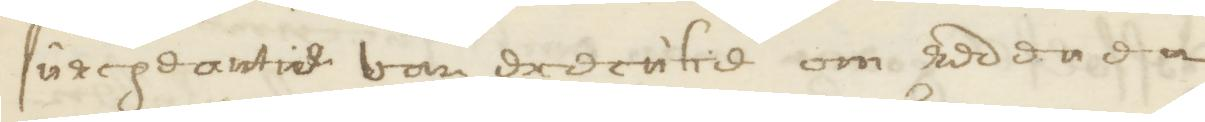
surcheantie van executie om redenen
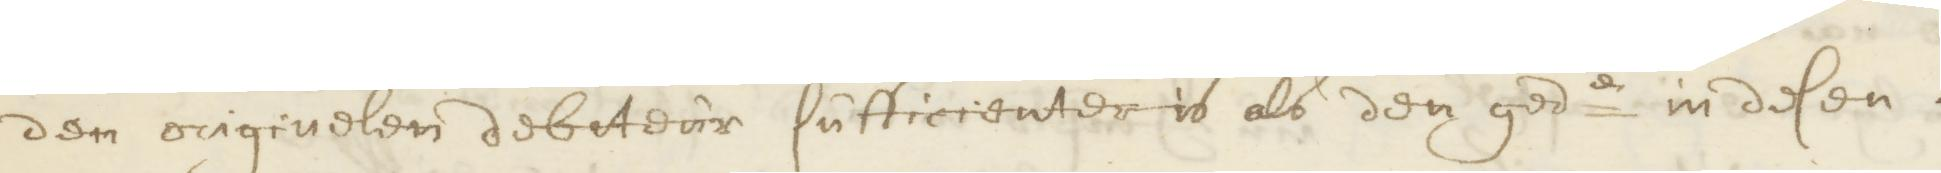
den originelen debiteur sufficienter is als den ged=e in desen
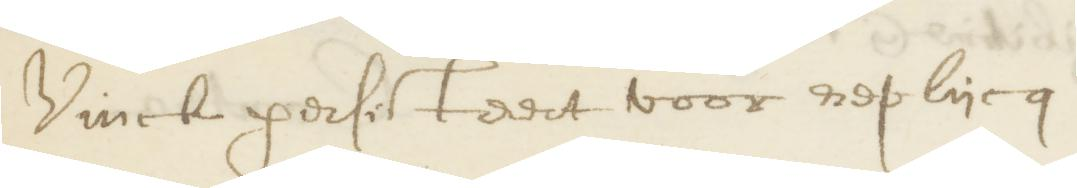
Vinck persisteert voor replijcq
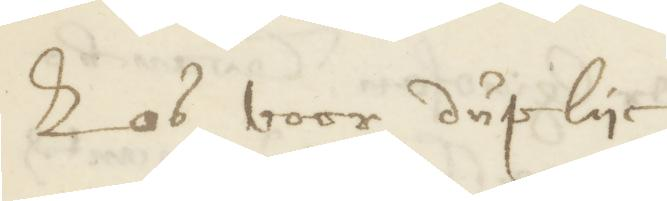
Zas voor duplijcq
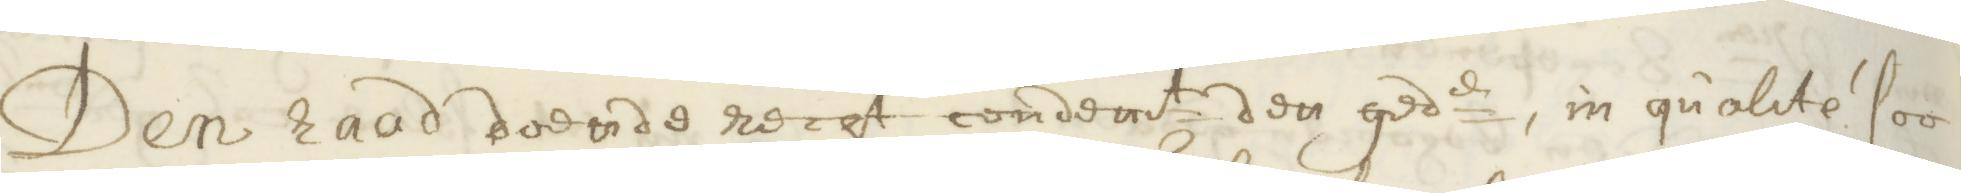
Den raad doende recht condem=t den ged=e, in qualité soo
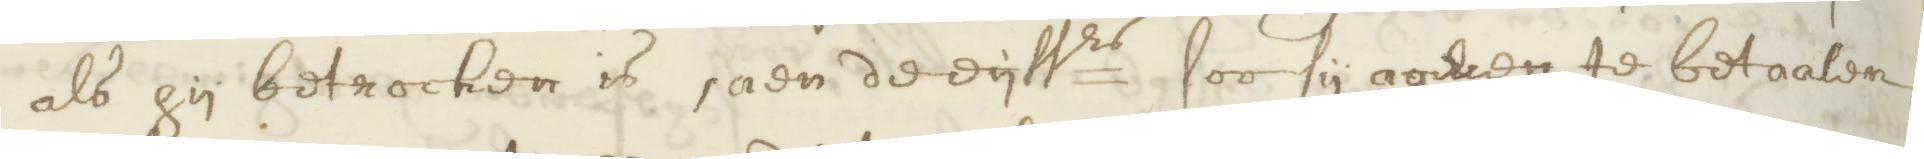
als hij betrocken is, aen de eijss=rs soo sij ageren te betaalen
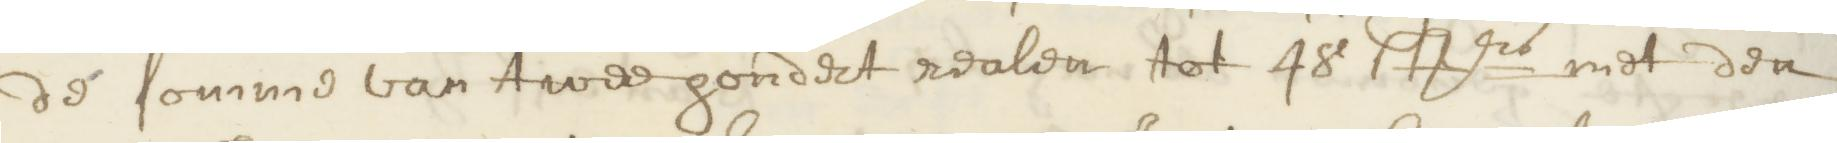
de somme van twee hondert realen tot 48 stver=rs met den
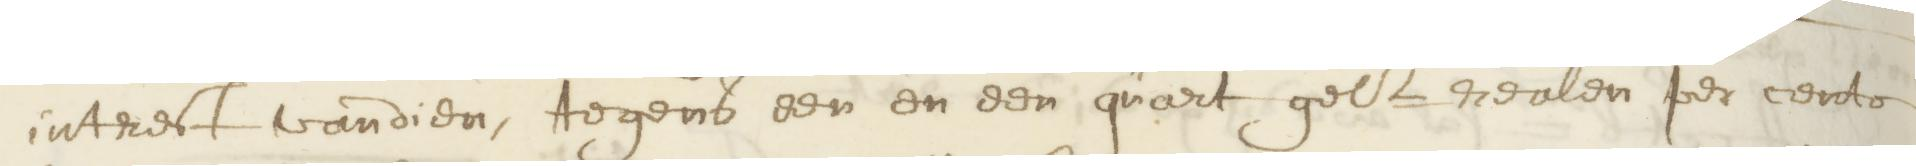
intrest vandien, tegens een en een quart gelijk realen per cento
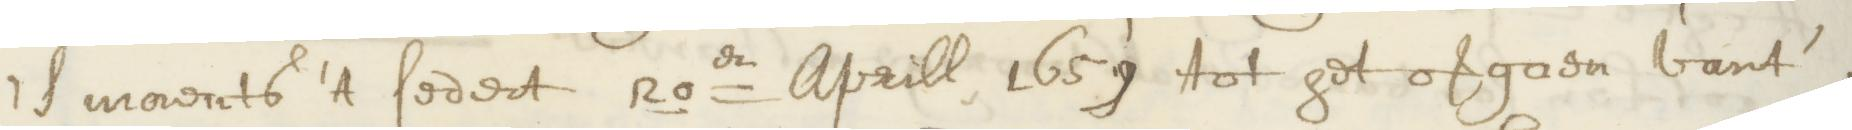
's maents ’t sedert 20=en aprill, 1659 tot het overgaen vant'
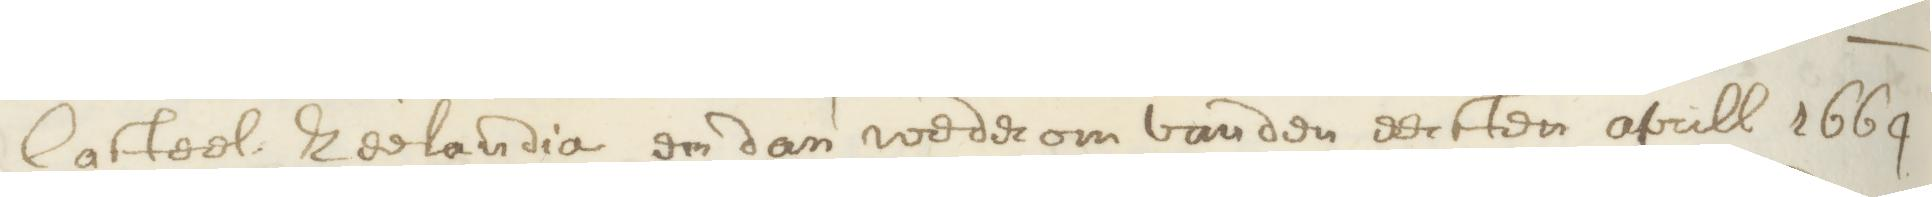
Casteel Zeelandia en dan wederom van den eersten aprill 1669
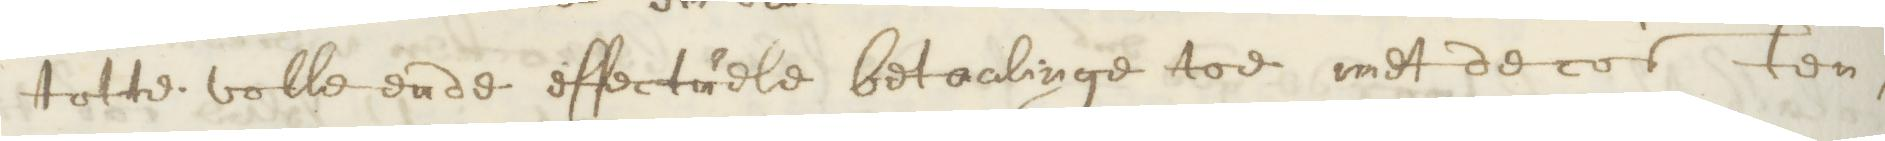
totte volle ende effectuele betaalinge toe met de costen
